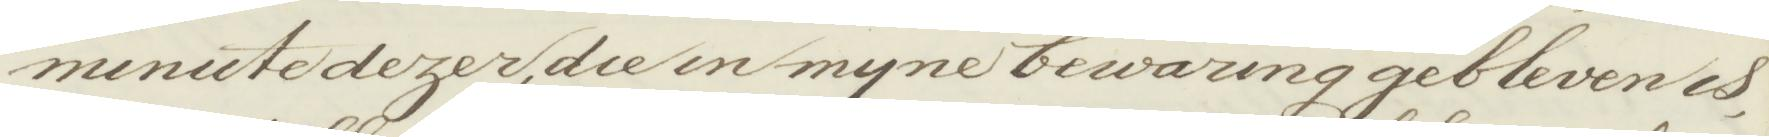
minute dezer, die in myne bewaring gebleven is,
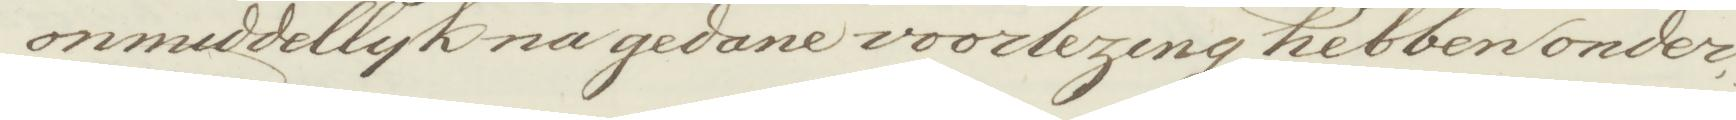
onmiddellyk na gedane voorlezing hebben onder,
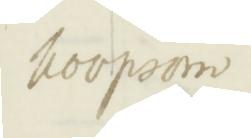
Koopsom
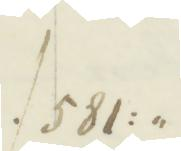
ƒ581:„
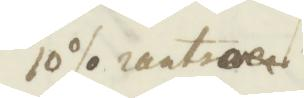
10% rantsoen
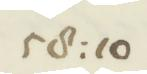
58:10
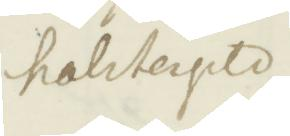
halstergeld
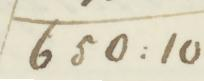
ƒ 650:10
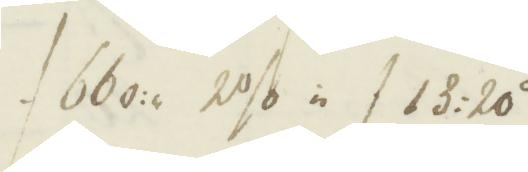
ƒ 660:„ 2% „ ƒ 13:20
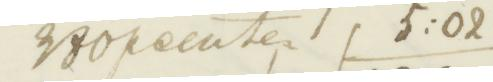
38opcenten 5:02
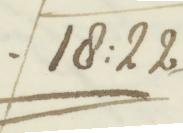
ƒ 18:22
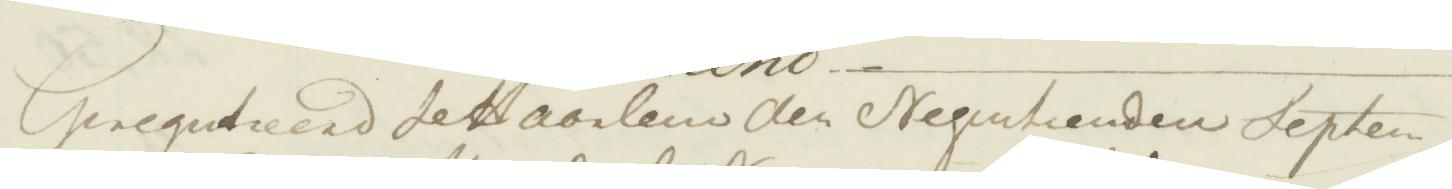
Geregistreerd te Haarlem den Negentienden Septem
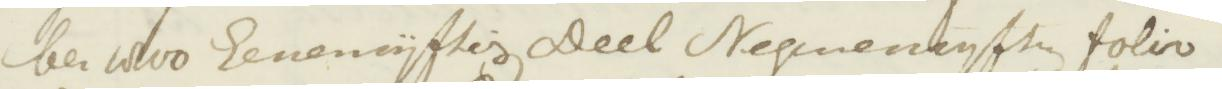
ber 1800 Eenenvijftig Deel Negenenvyftig folio
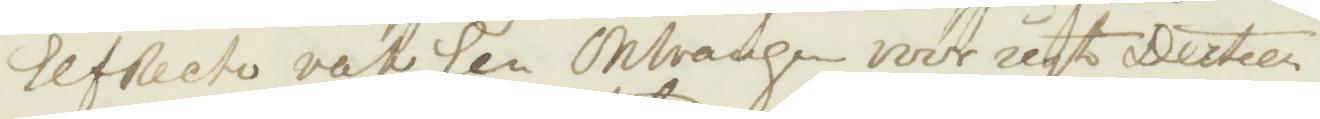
Elf Recto vak Een Ontvangen voor regt Dertien
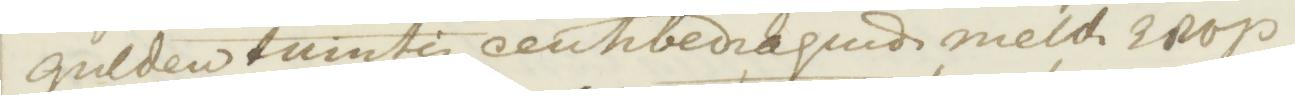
gulden twinten cents bedragende meld 38op
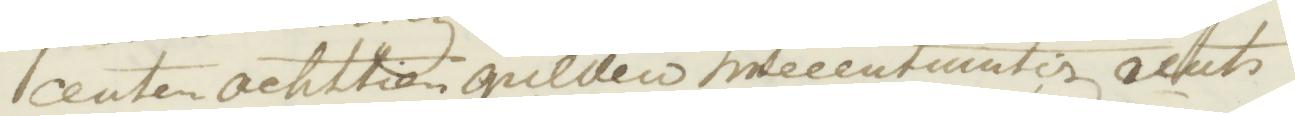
centen achttien gulden tweeentwintig cents
